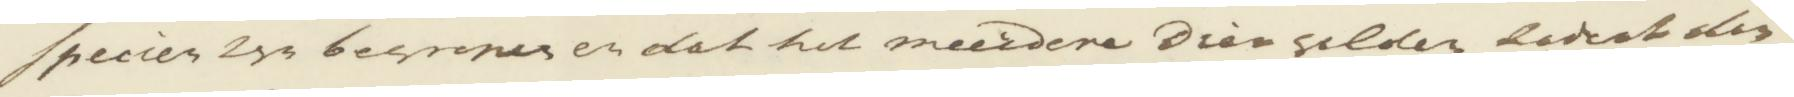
specien zyn begrepen en dat het meerdere dien gelden zedert den
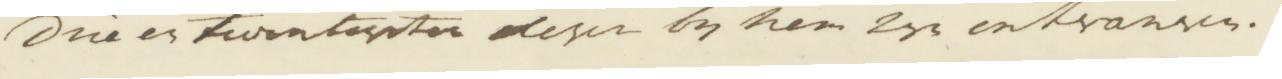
drie en twintigsten dezer by hem zyn ontvangen.
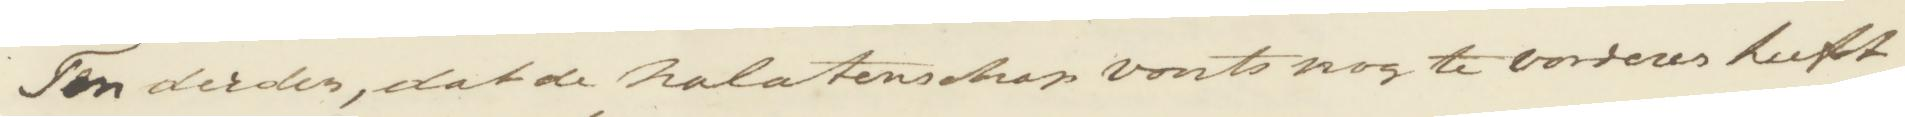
Ten derden, dat de nalatenschap voorts nog te vorderen heeft
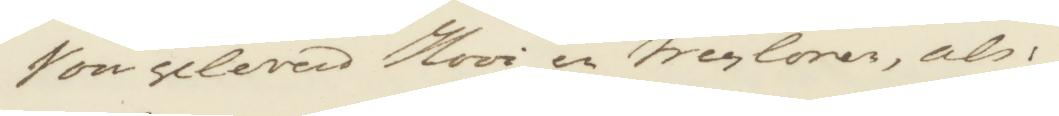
Voor geleverd Hooi en weylonen, als:
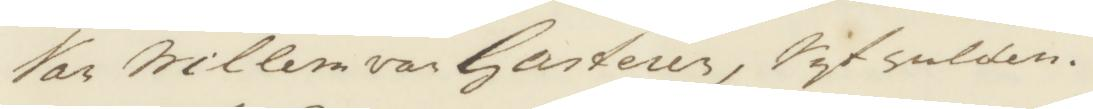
Van Willem van Gasteren, Vijf gulden.
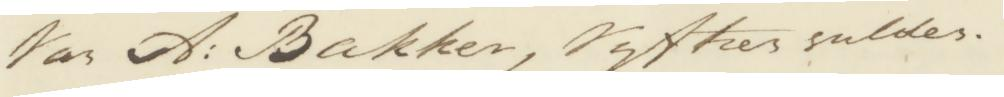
Van A: Bakker, Vyftien gulden.
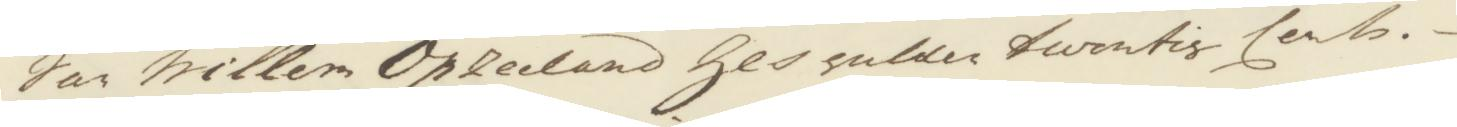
Van Willem Opzeeland Zes gulden twintig Cents.-
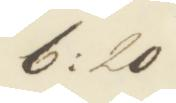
6: 20
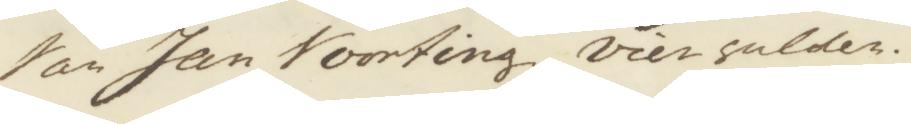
Van Jan Voorting, vier gulden.
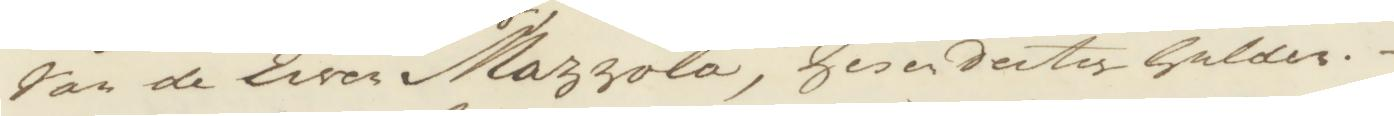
Van de Erven Mazzola, Zes en dertig Gulden.
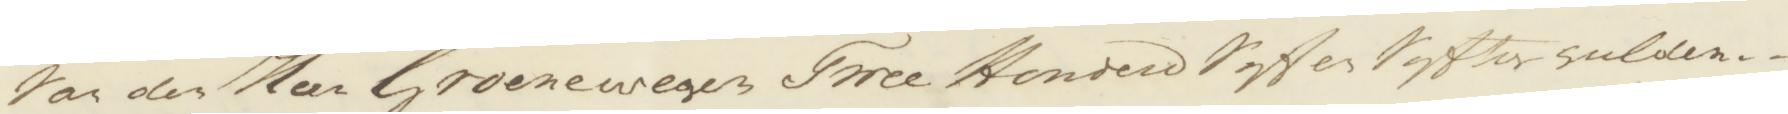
van den Heer Groenewegen Twee Honderd Vyf en Vyftig gulden.-
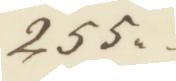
255„
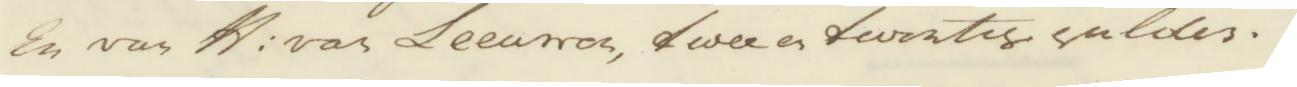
En van H: van Leeuwen, twee en twintig gulden.
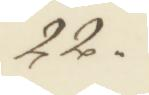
22„
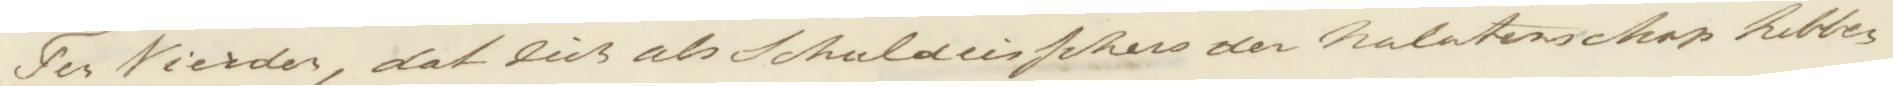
Ten Vierden, dat zich als schuldeisschers der nalatenschap hebben
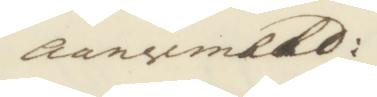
aangemeld:
